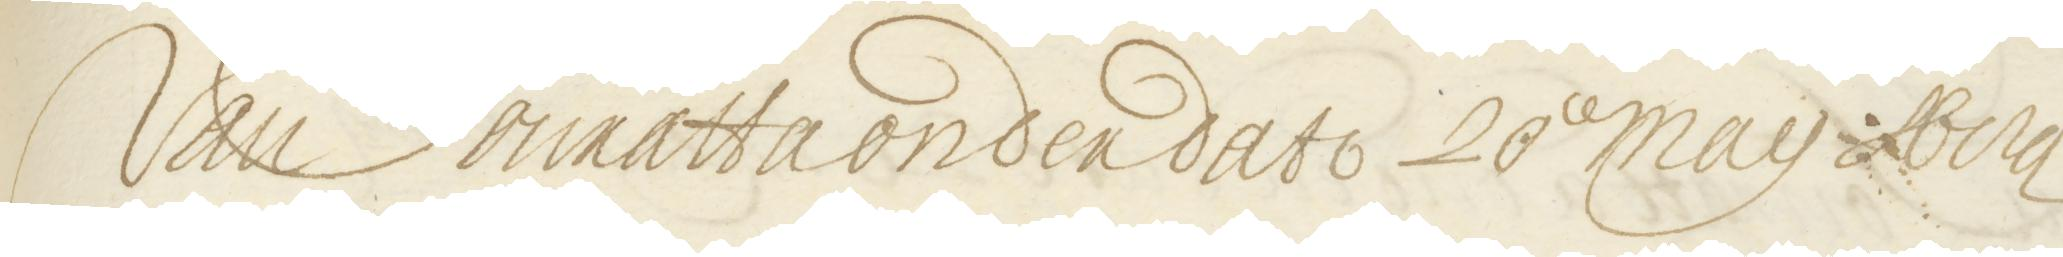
Van Souratta onder dato 20 maij 1684
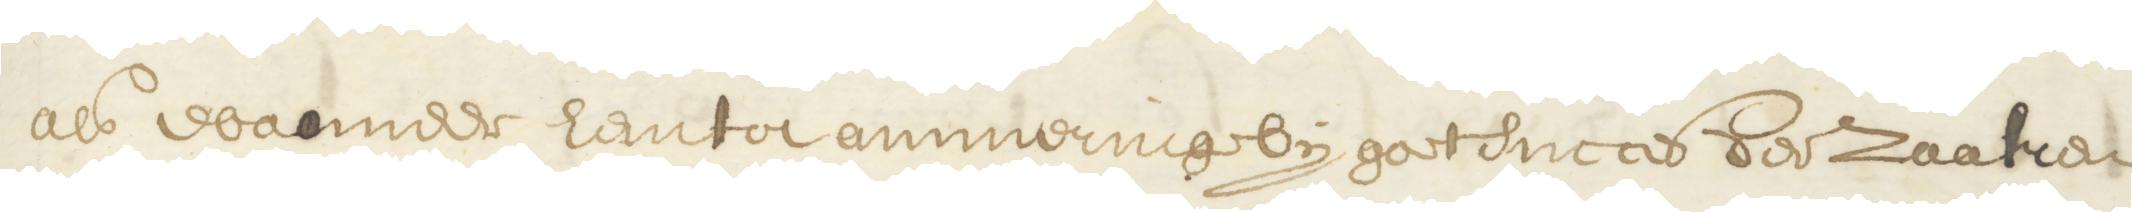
als wanneer hem tot animeringe bij goet succes derzaaken
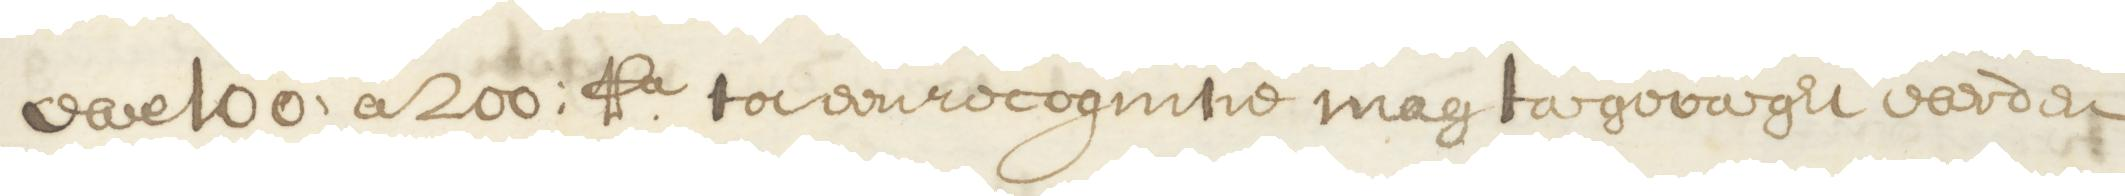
wel 100: a 200: R:a tot een recognitie mag toegevoeght werden
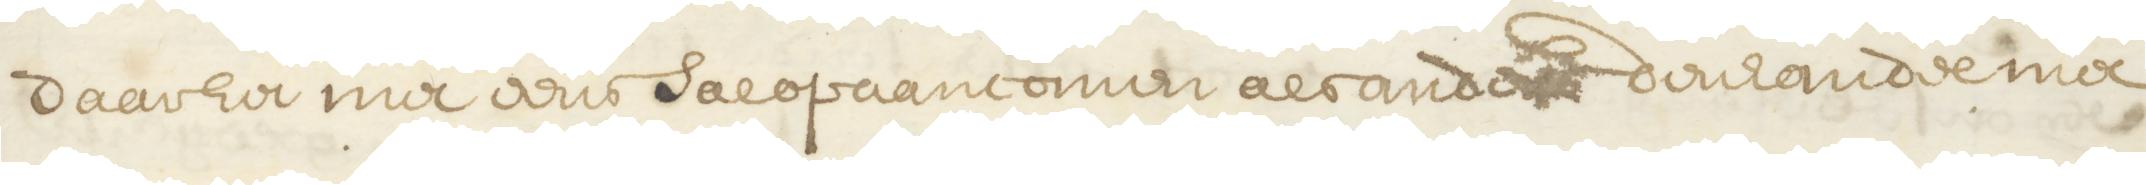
daar het niet eens sal op aancomen als anders denhandel met
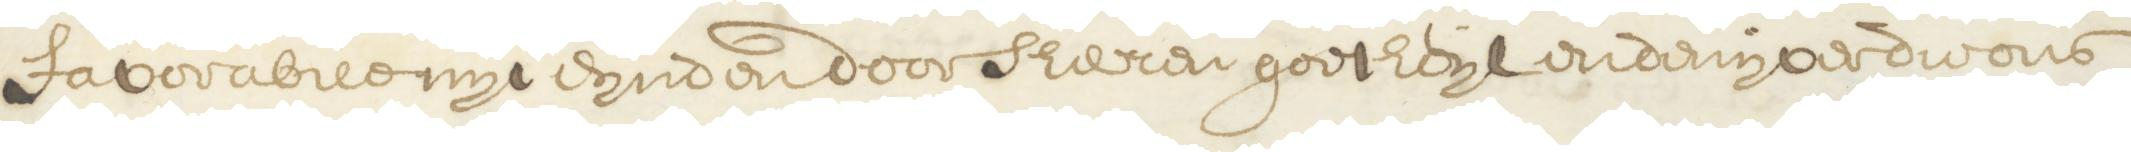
favorabile uijt eijnden door s heeren goetheijt endenijver die ons
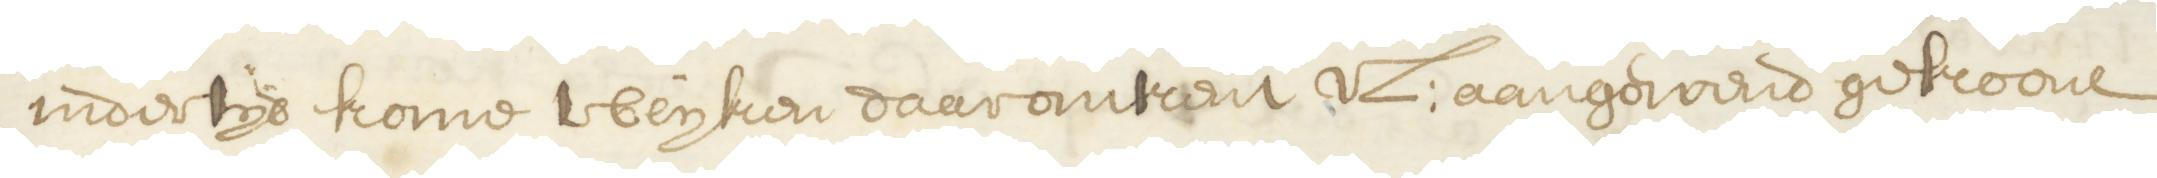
indertijd kome teblijken daaromtrent vL: aangewend gekoone
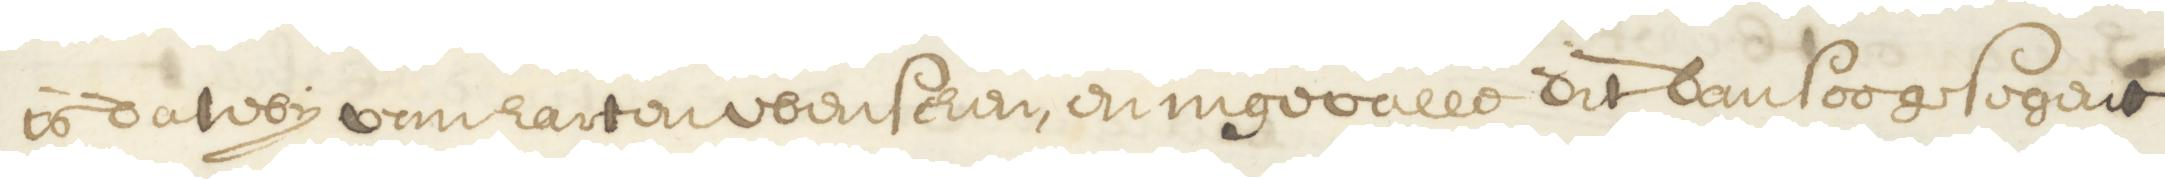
is datwij van harten wenschen, en ingevalle dit dan soo gesegent
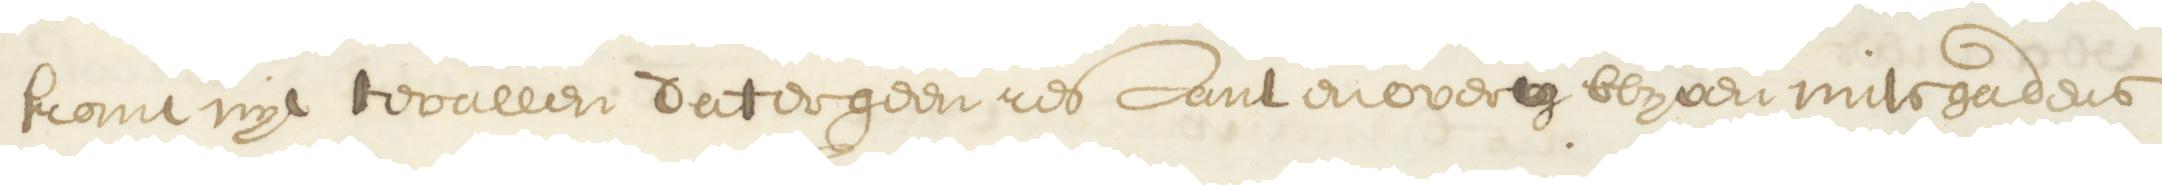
komt uijt tevallen dat er geen restant en overig blyven mitsgaders
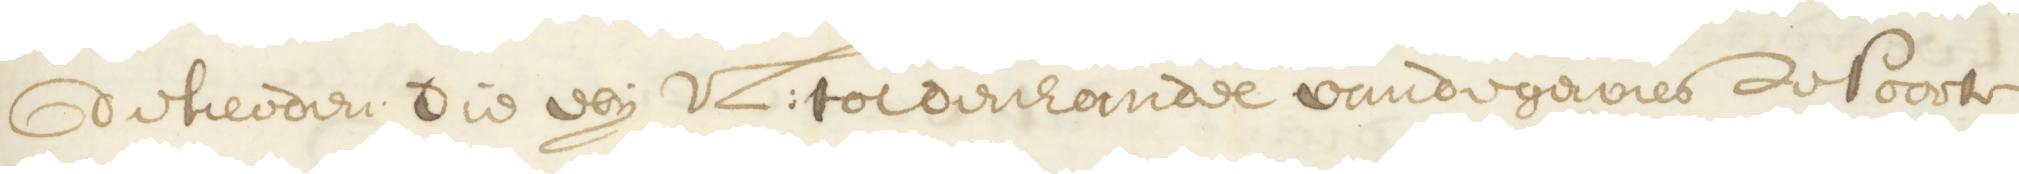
de kleden die wij vL: tot denhandel van de gewilste soorte
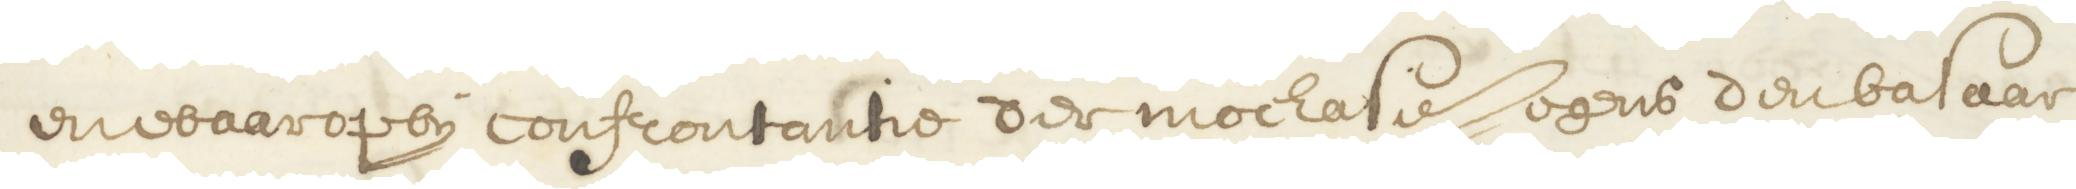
en waar op bij confrontantie der mochase Jegens den basaar
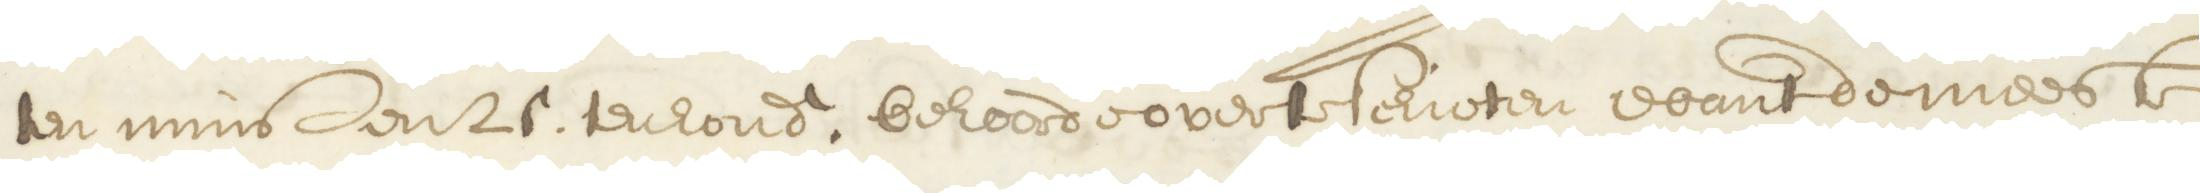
ten minsten 25. tenhond.t behoorde over te schieten want de meeste
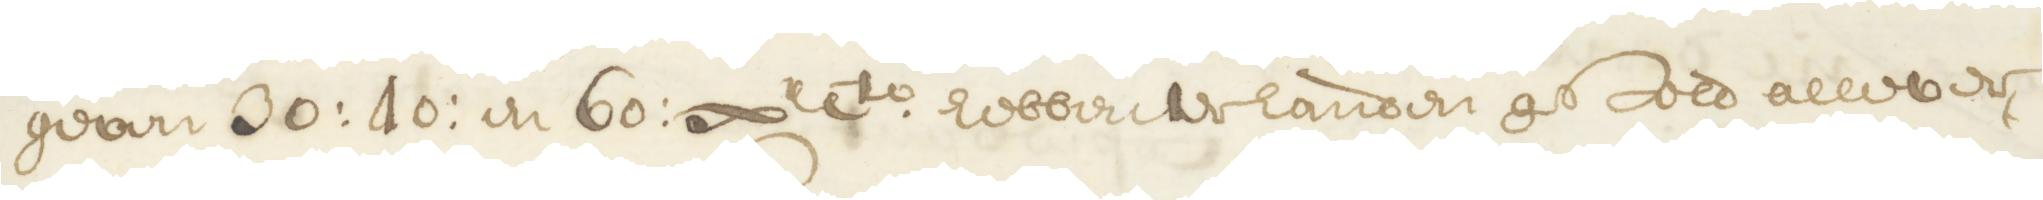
geven 30: 40: en 60: prc.to hebben ter handen gesteld allever„
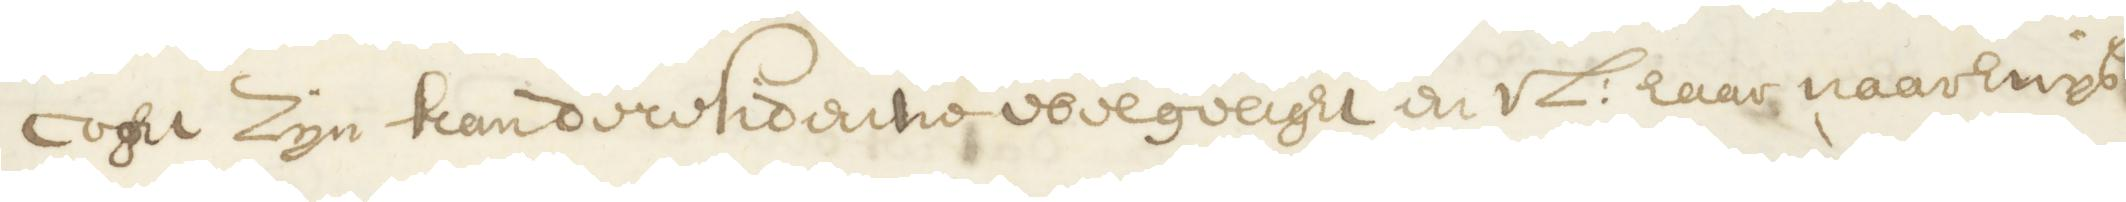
coght zijn kan deresidentie wel gelight en vL: haar naarhuijs
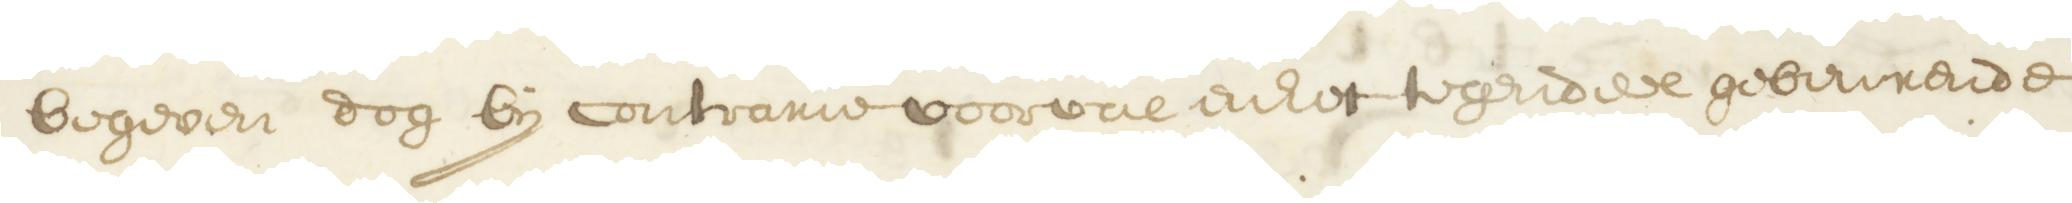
begeven dog bij contrarie voorval en het tegendeel gebeurende
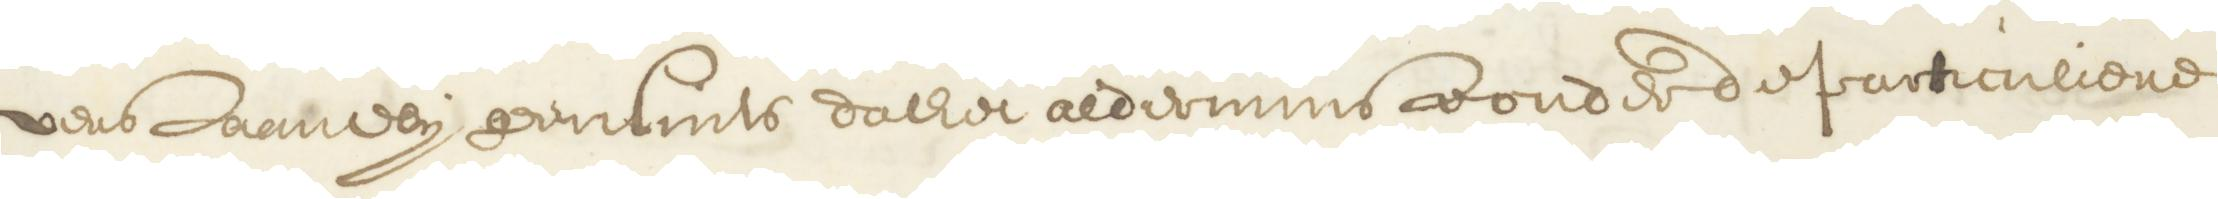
verstaan wij geensints dathet alderminste onder de particuliere
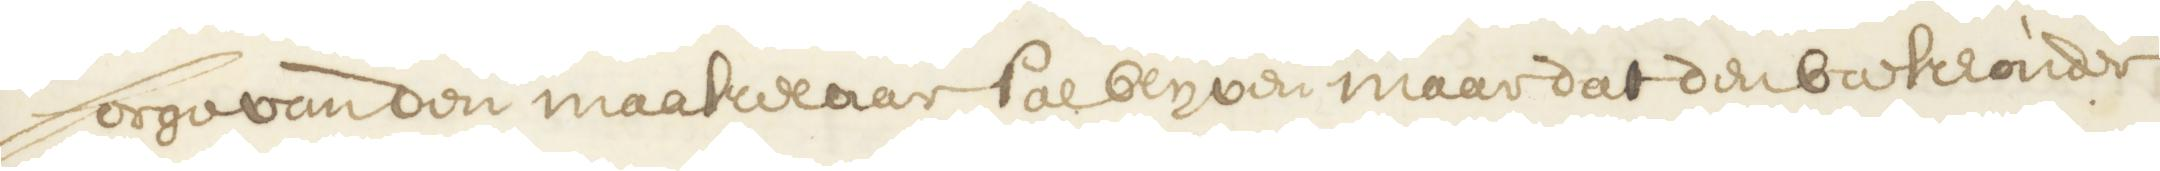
sorge van den maakelaar sal blijven maar dat den boekhouder
